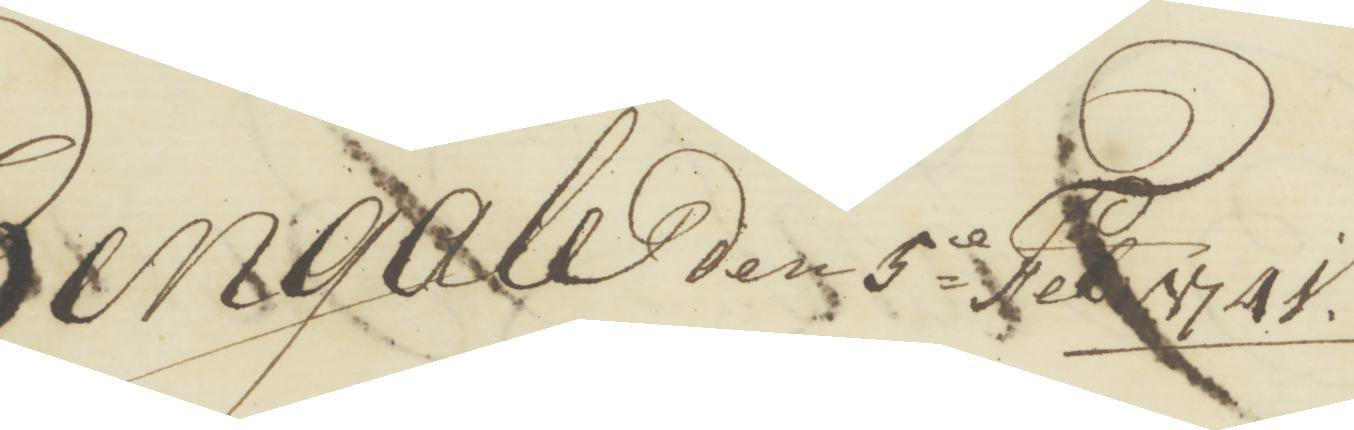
Van Bengale den 5=e Feb 1741.
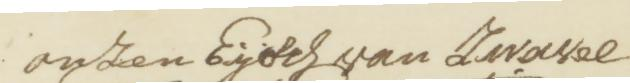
onzen Eijsch van zwavel
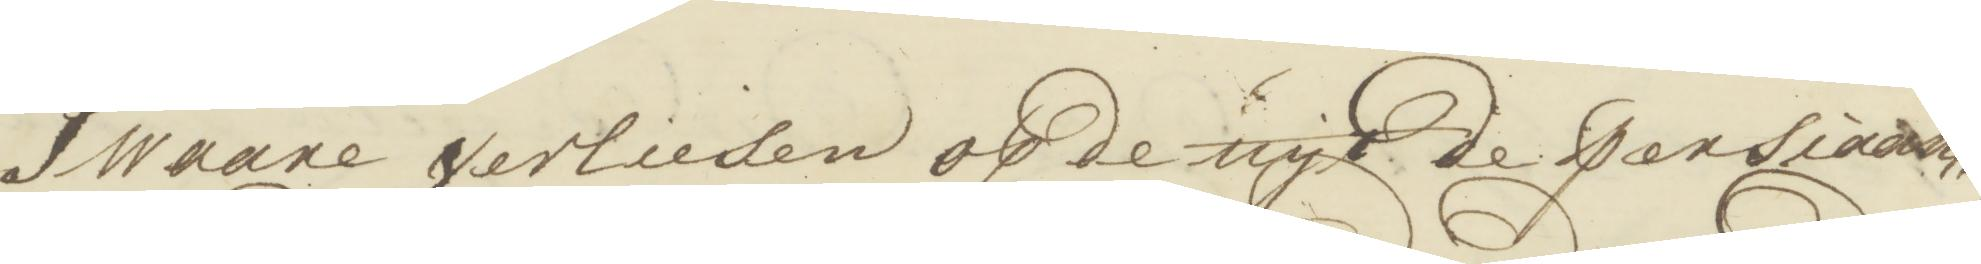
Swaare verliesen op de uijt de persiaan„
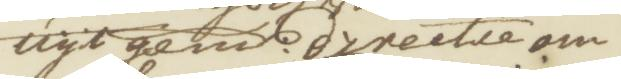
uijt gem: directie om
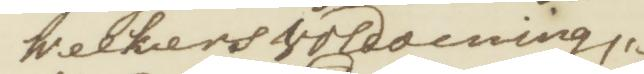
welkers voldoeningen
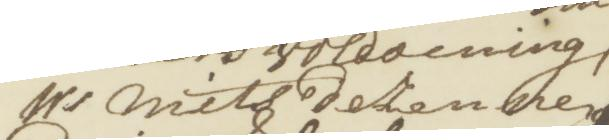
w'mits dezen ven.
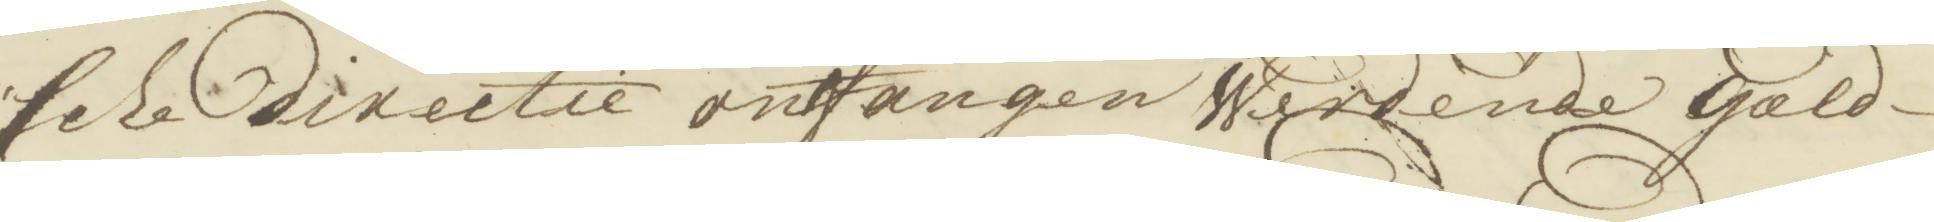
sche directie ontangen wordende geld
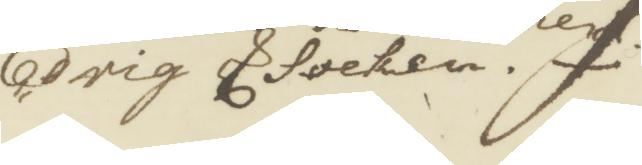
„drig versoeken.
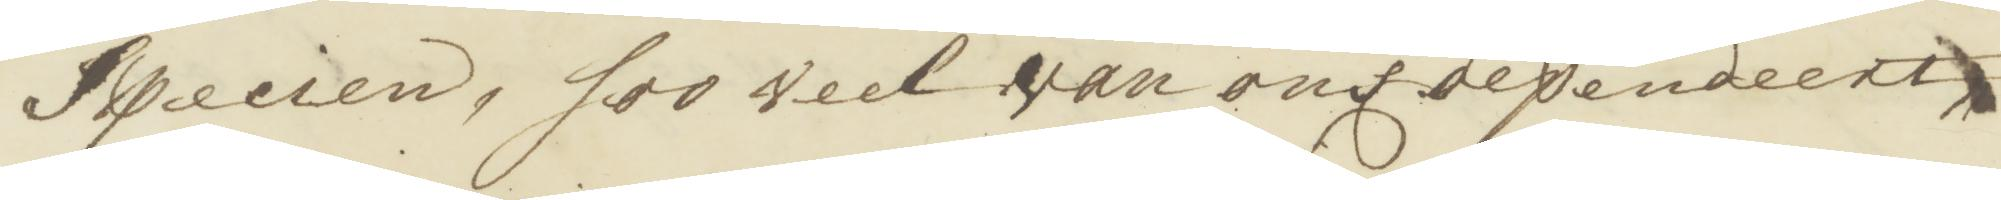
specien, soo veel van ons dependeert
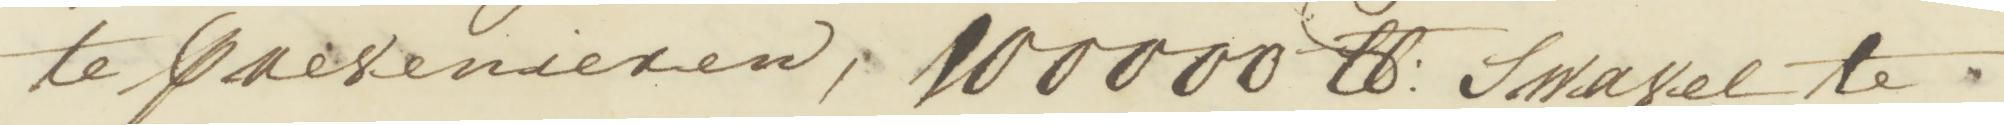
te prevenieren, 100000 lb: swavel te
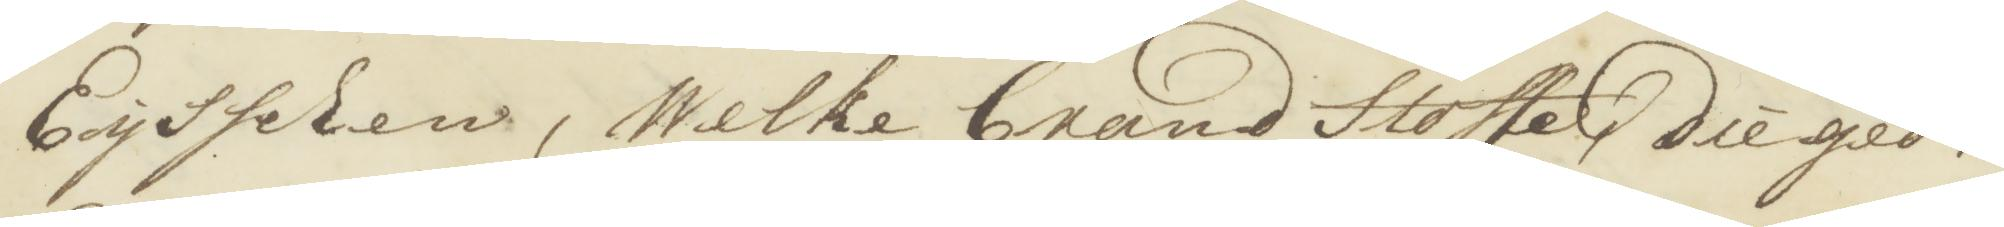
Eijsschen, welke brandstoffe, die ged„te
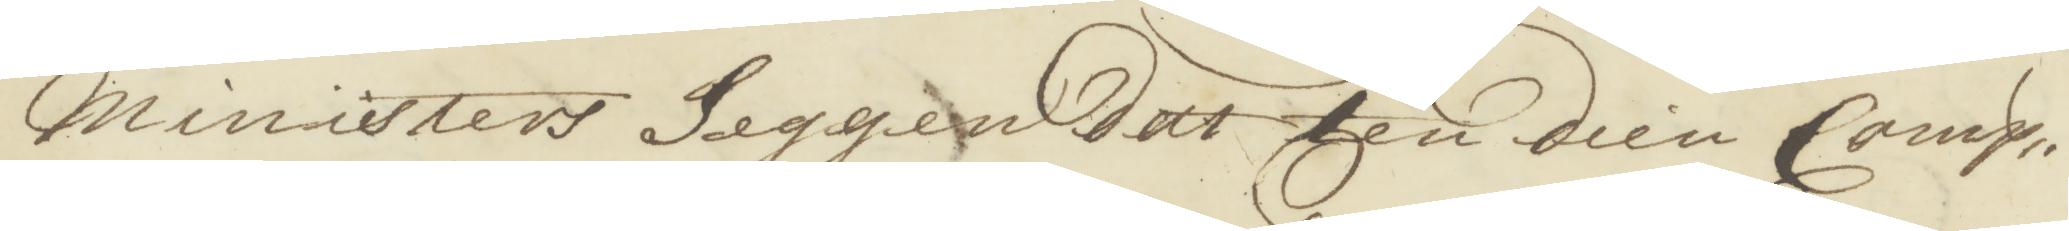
ministers seggen dat ten dien Comp„
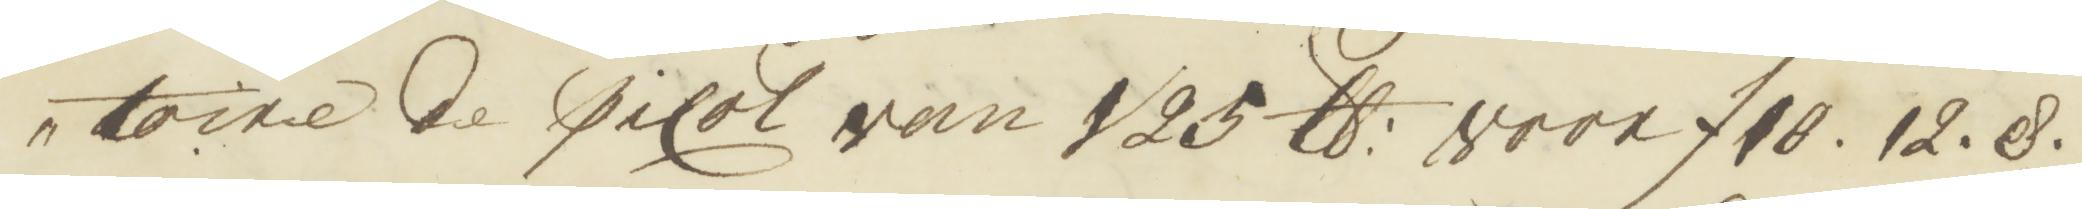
„toire de picol van 125 lb: voor ƒ10. 12. 8.
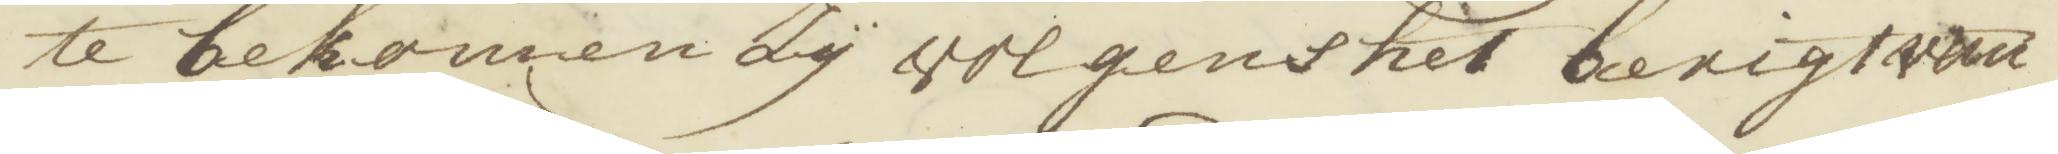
te bekomen zij volgens het berigt van
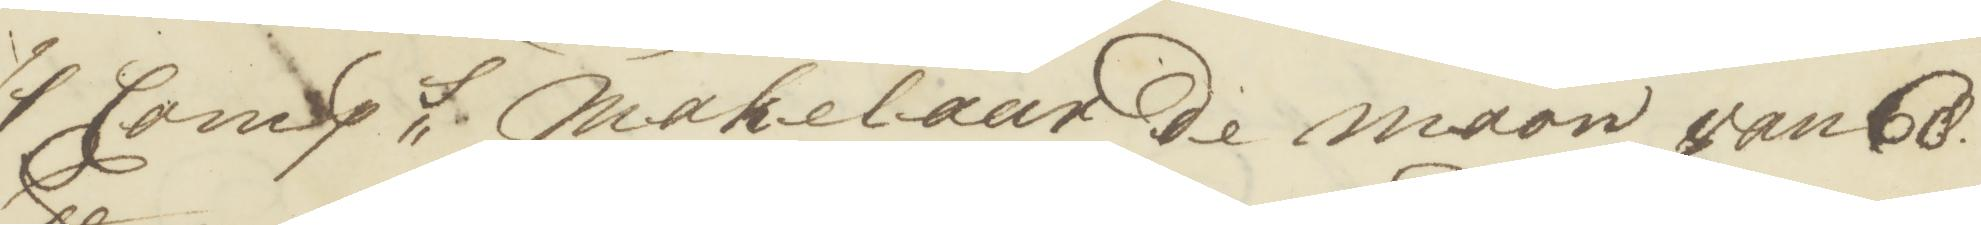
's Comp„s makelaar de maon van 68.
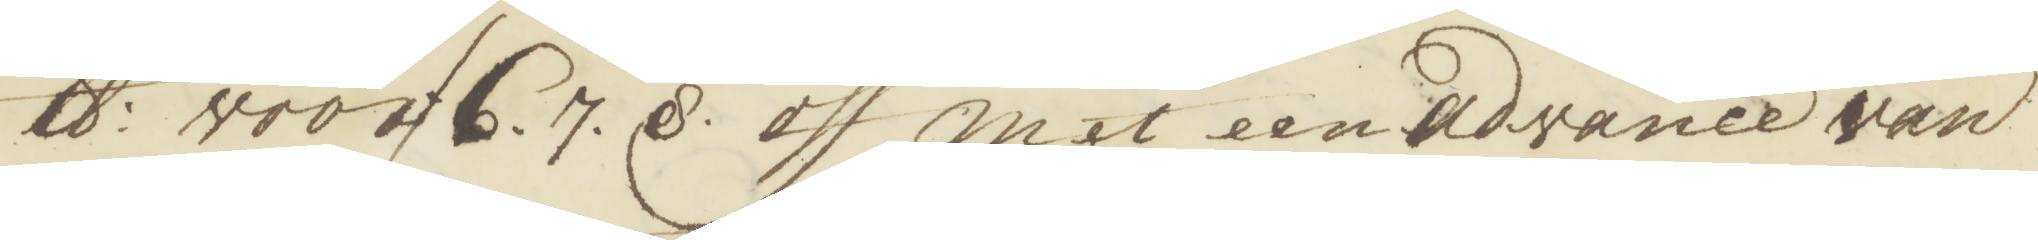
lb: voor ƒ6. 7. 8. off met een advance van
